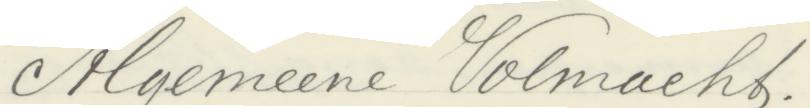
Algemeene Volmacht.
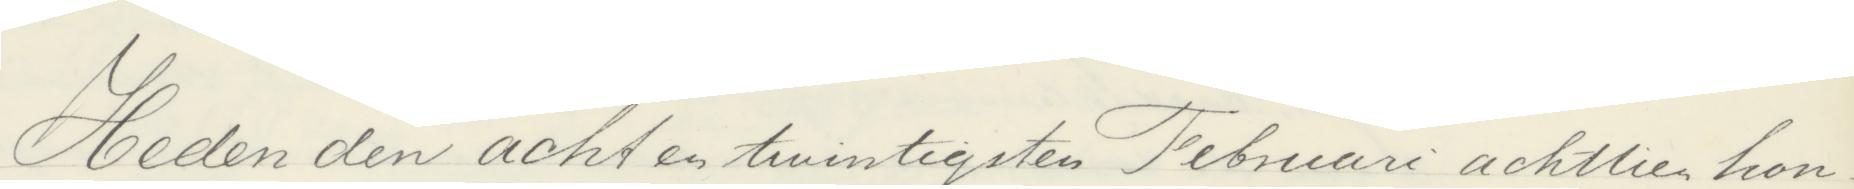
Heden den acht en twintigsten Februari achttien hon
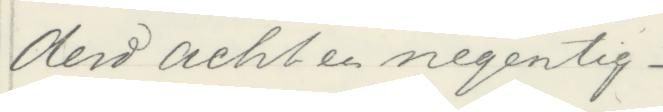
derd acht en negentig
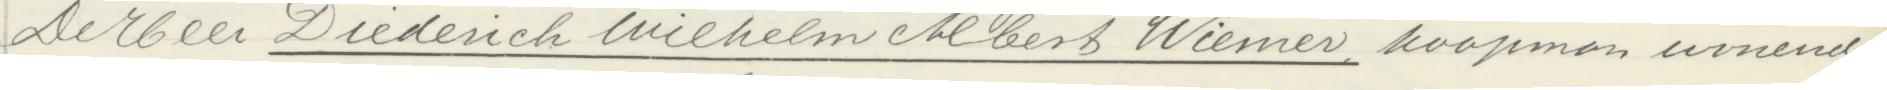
De Heer Diederich Wilhelm Albert Wiemer, koopman wonende
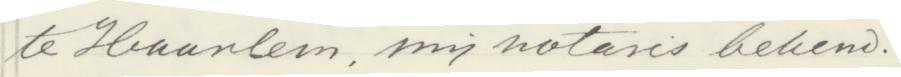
te Haarlem, mij notaris bekend.
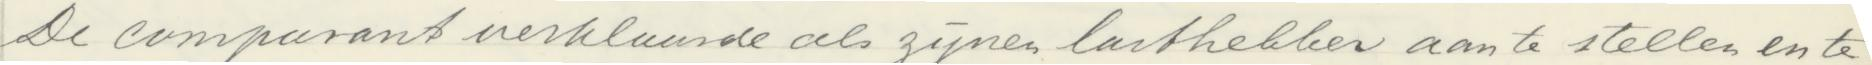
De comparant verklaarde als zijnen lasthebber aan te stellen en te
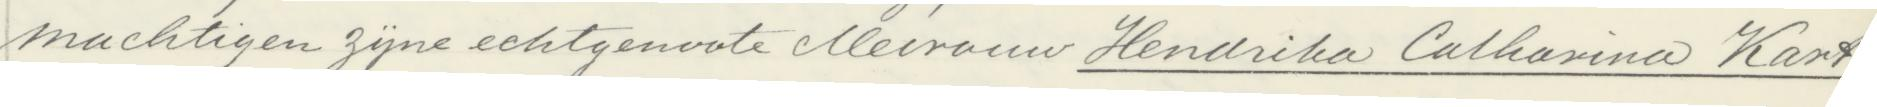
machtigen zijne echtgenoote Mevrouw Hendrika Catharina Kart-
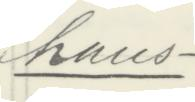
haus
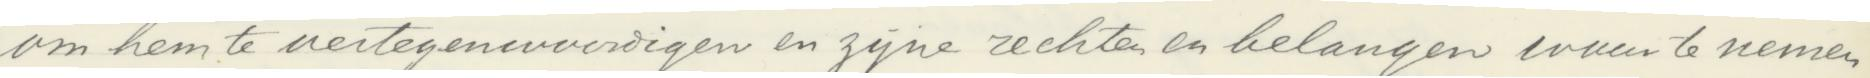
om hem te vertegenwoordigen en zijne rechten en belangen waar te nemen
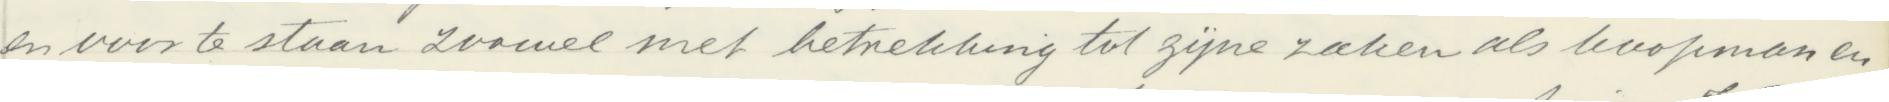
en voor te staan zoowel met betrekking tot zijne zaken als koopman en
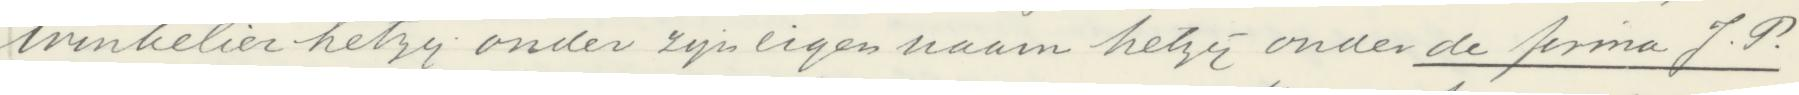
winkelier hetzij onder zijn eigen naam hetzij onder de firma J. P.
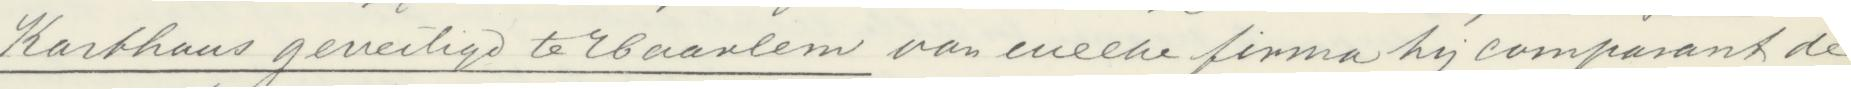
Karthaus gevestigd te Haarlem van welke firma hij comparant de
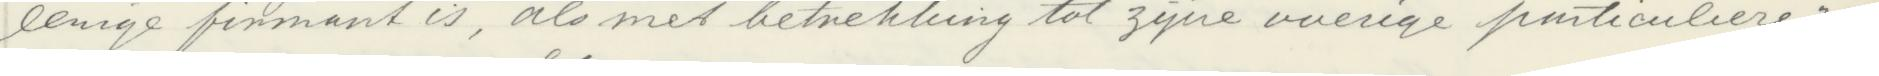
eenige firmant is, als met betrekking tot zijne overige particuliere za
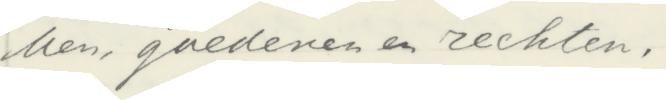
ken, goederen en rechten.
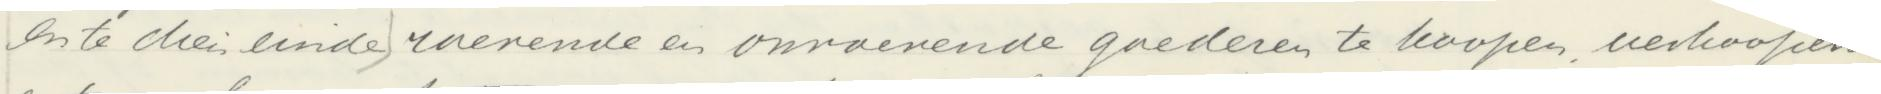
en te dien einde roerende en onroerende goederen te koopen, verkoopen
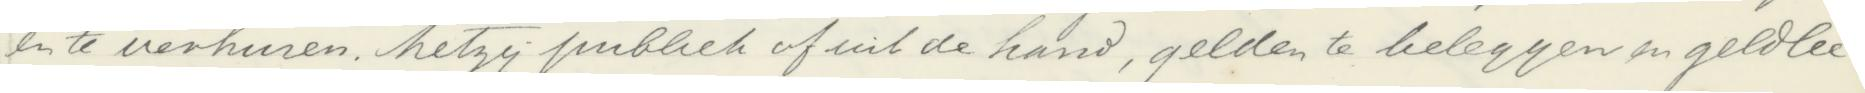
en te verhuren, hetzij publiek of uit de hand, gelden te beleggen en geldlee
